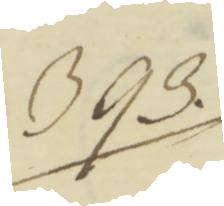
393.
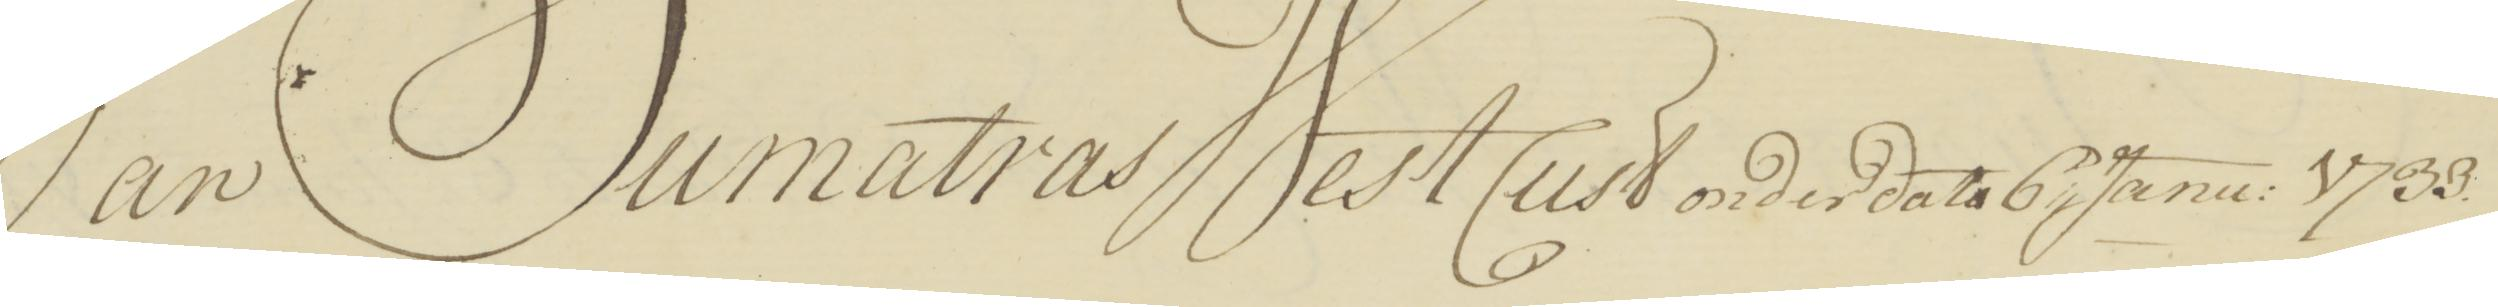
Van Sumatras West Cust onder dato 6„ Janu: 1733.
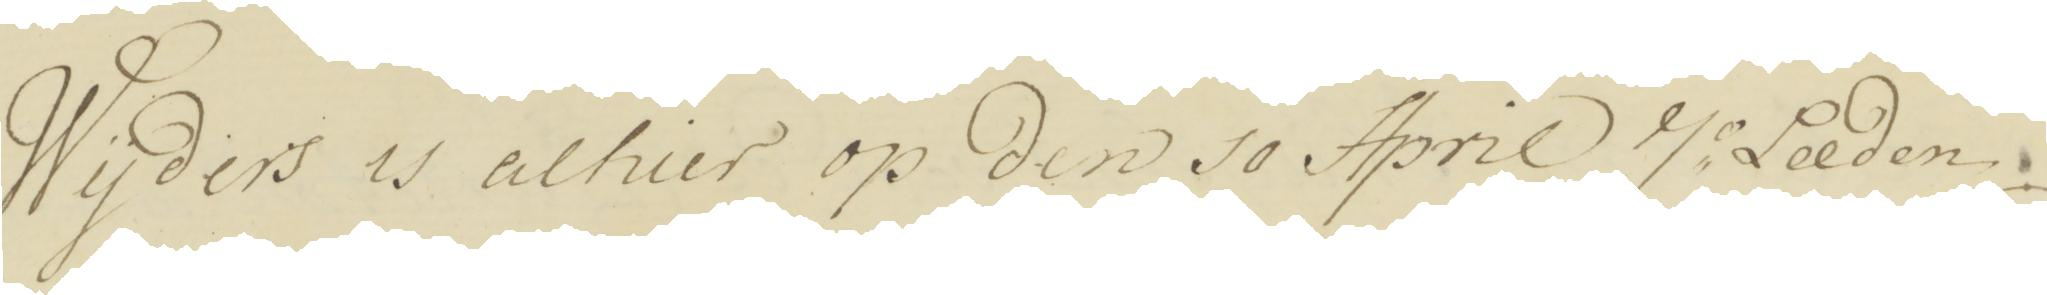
Wijders is alhier op den 10 April J„o Leeden
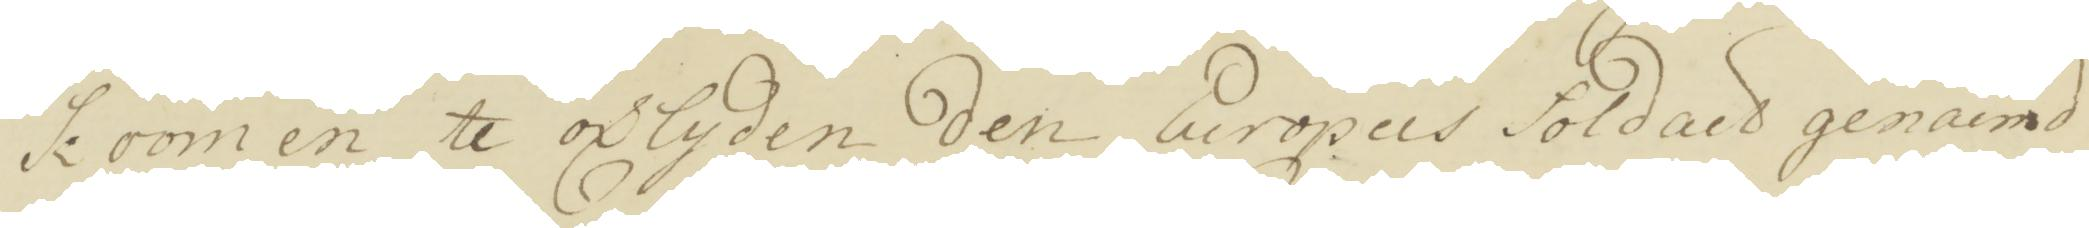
koomen te overlyden den Europees soldaet genaemd
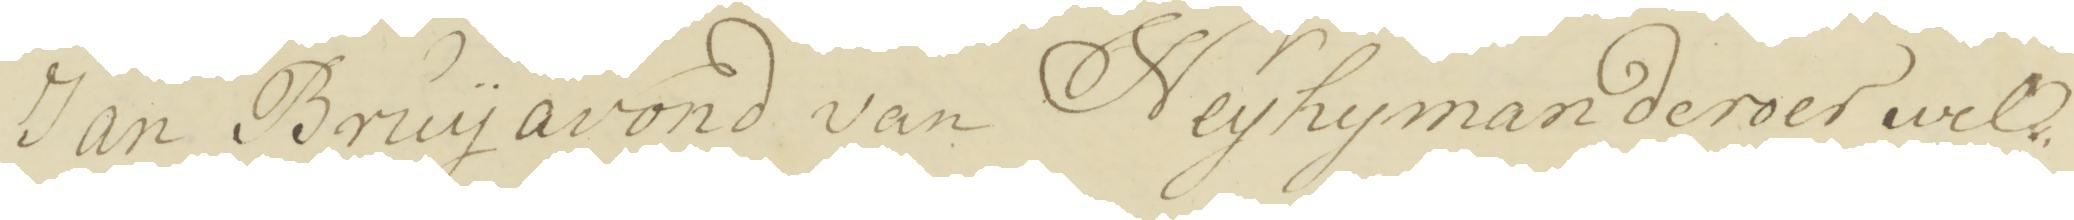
Ian Bruij avond van Keyhyman de roer wel„
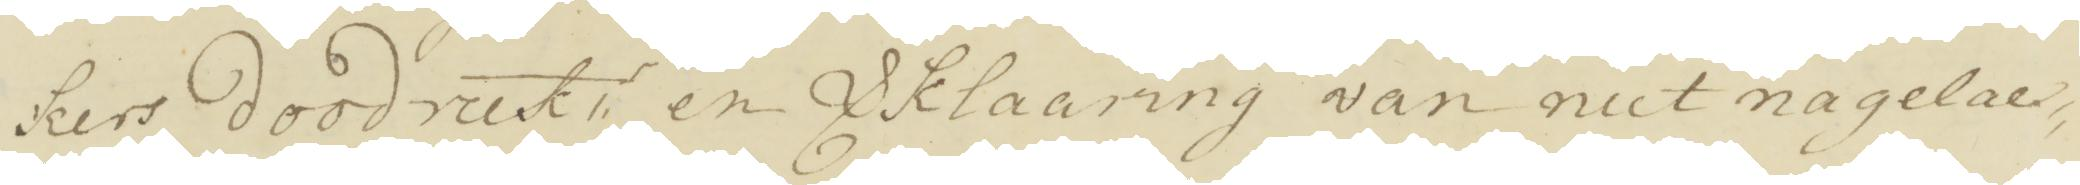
kers dood reek„s en verklaaring van niet nagelae„
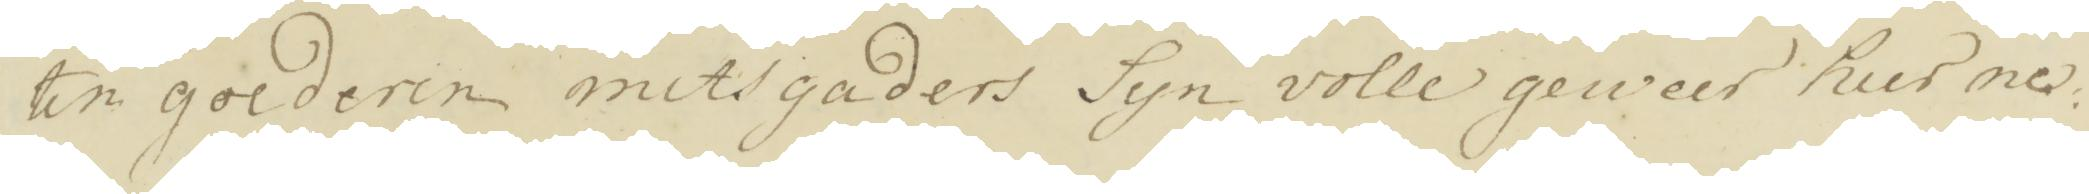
ten goederen mitsgaders syn volle geweer hier ne„
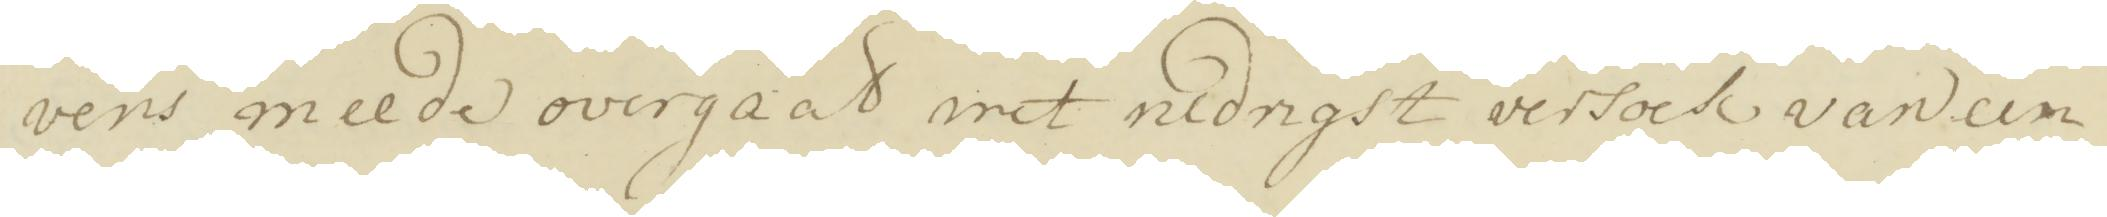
vens meede overgaat met nedrigst versoek van een
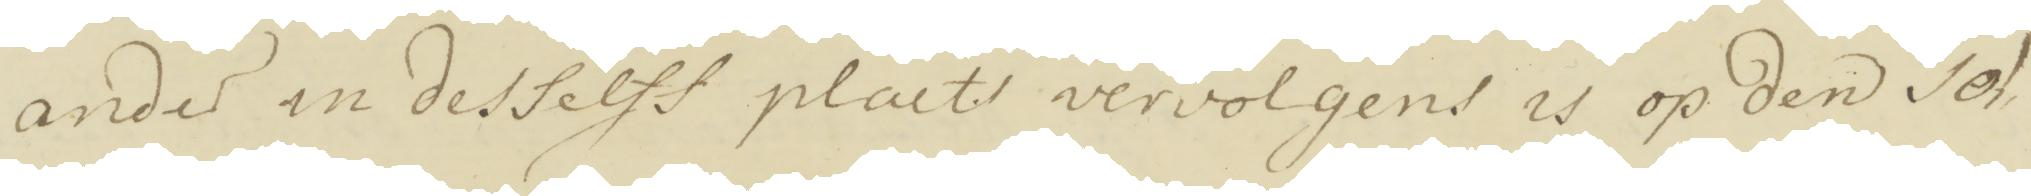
ander in desselfs plaets vervolgens is op den 10/
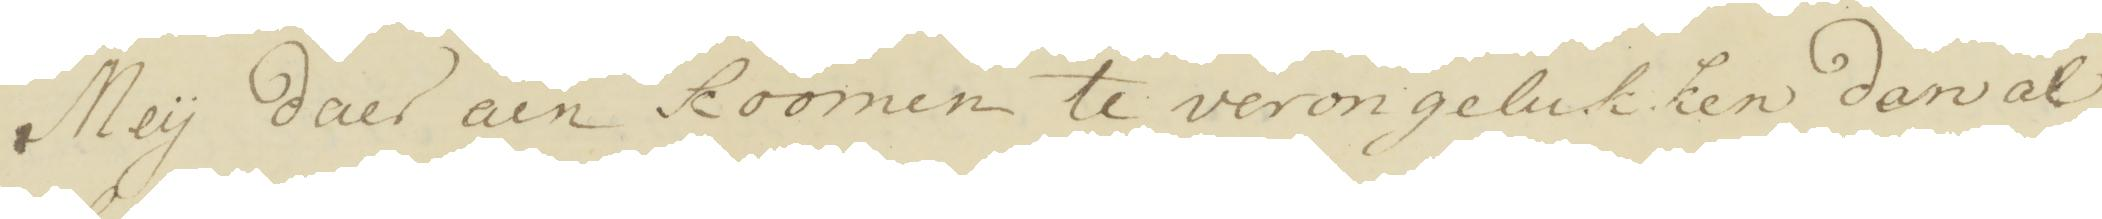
Meij daer aen koomen te verongelukken dan al
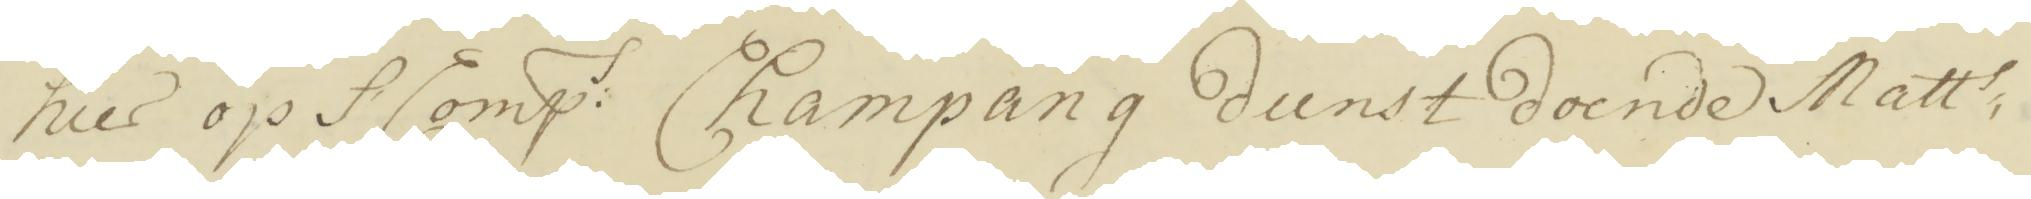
hier op s' Comp:s Champang dienst doende Matt„s
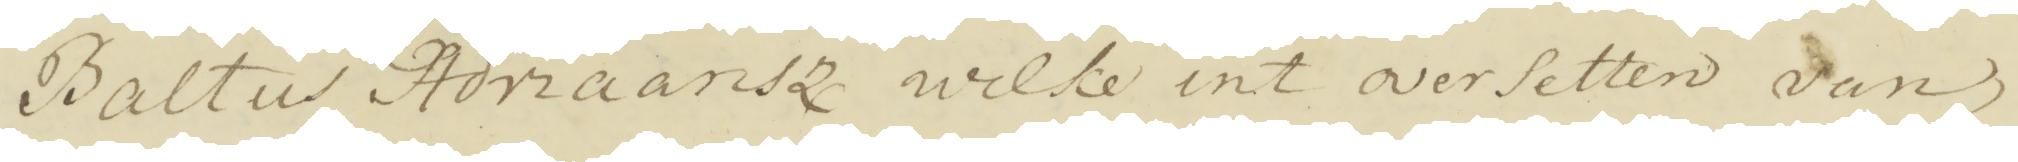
Baltus Adriaansz wilke in t oversetten van
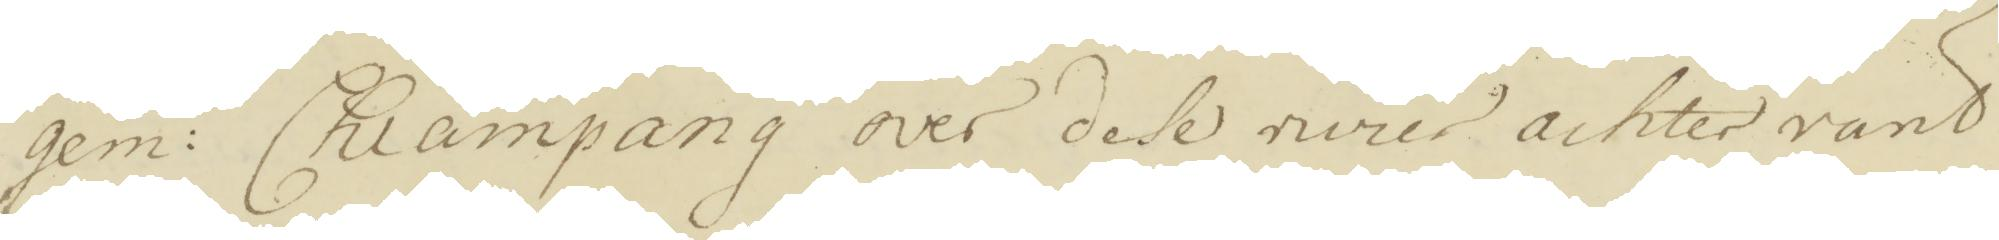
gem: Chiampang over dese rivier achter van t
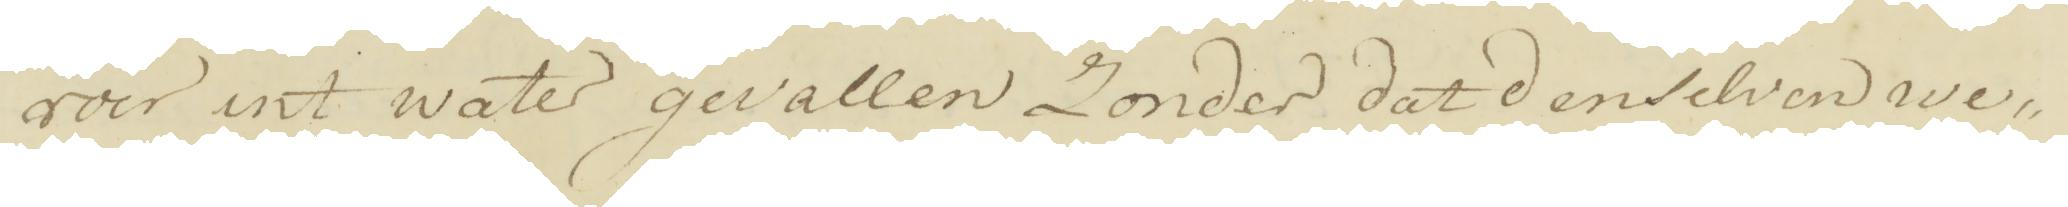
roer int water gevallen zonder dat denselven we„
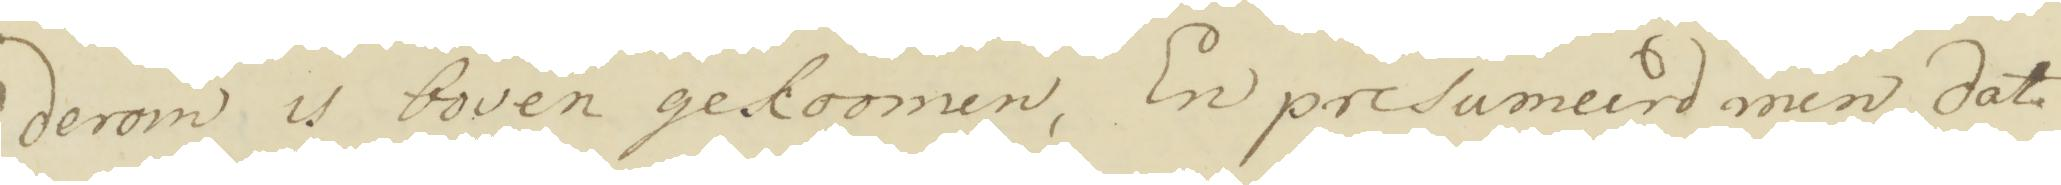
derom is boven gekoomen, En presumeerd men dat
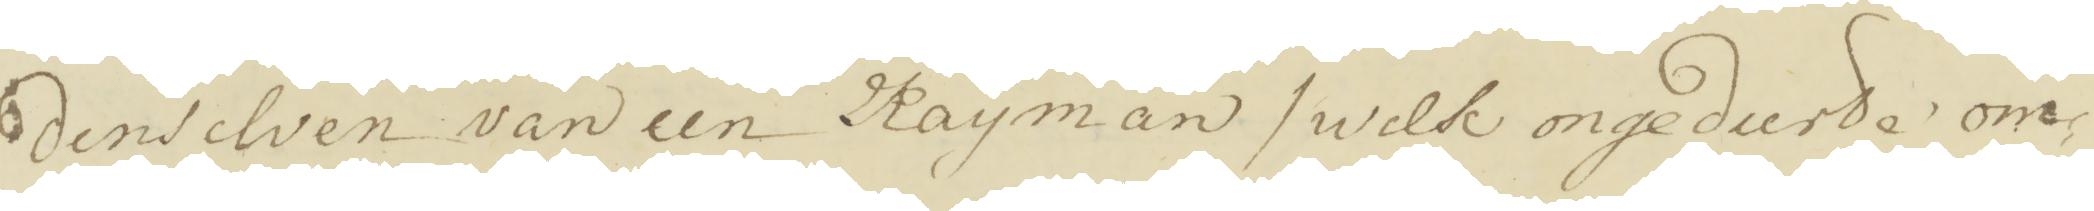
denselven van een Kayman / welk ongedierte om„
